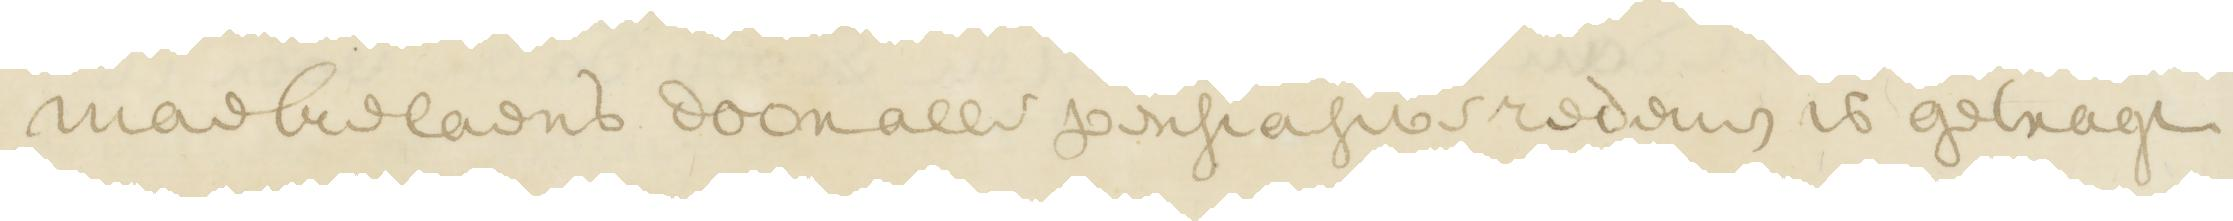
maekelaers door alle persiasive redenen is getragt
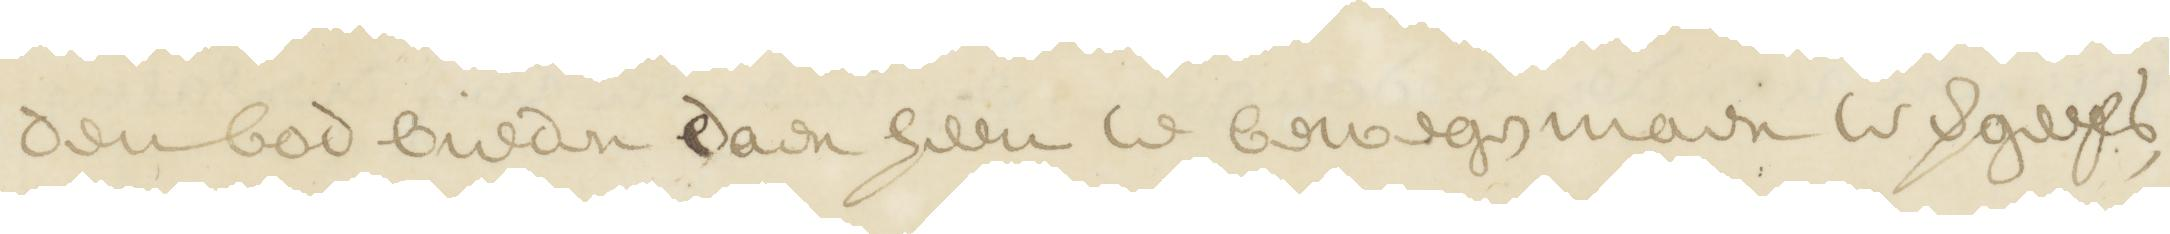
den bod bieder daer heen te bewegen maer te vergeefs,
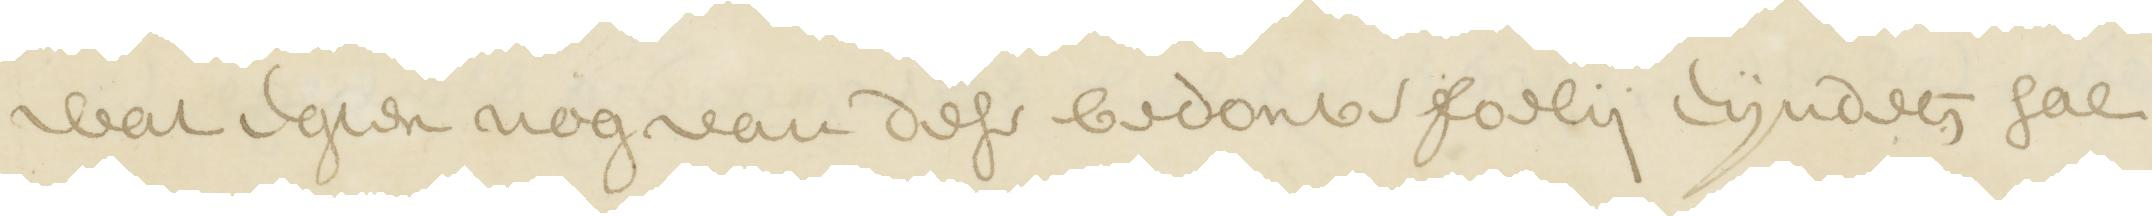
wat Egter nog van dese bedorve foelij Eijndelijk sal
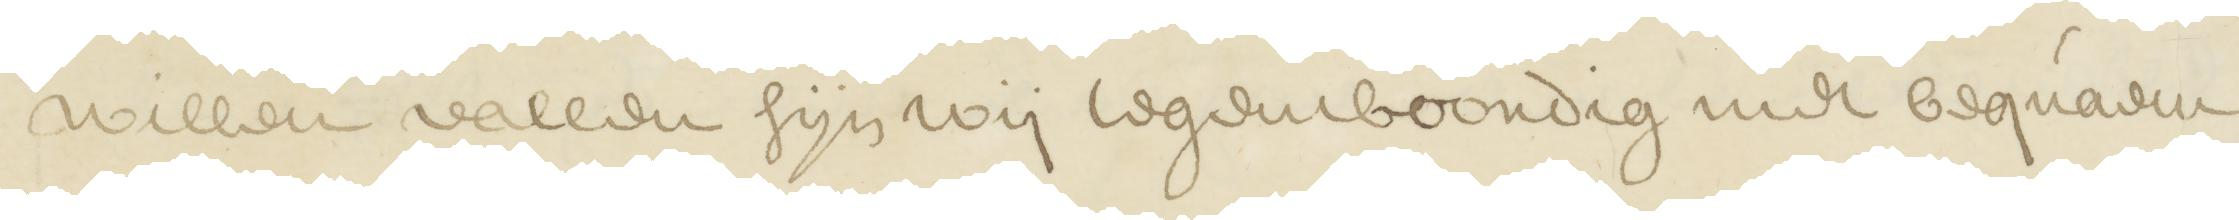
willen vallen sijn wij tegenwoordig niet bequaem
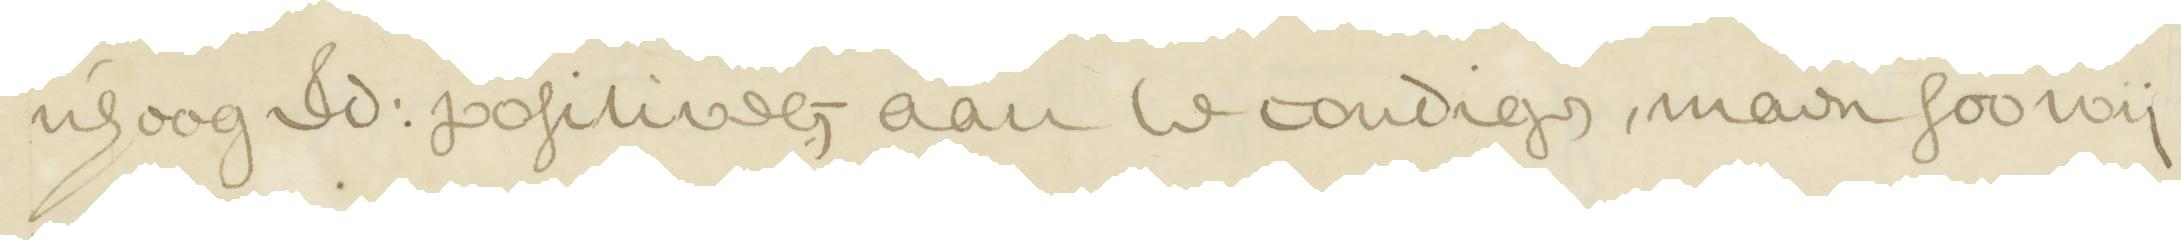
uhoog Ed: positivelijk aan te condigen, maer soo wij
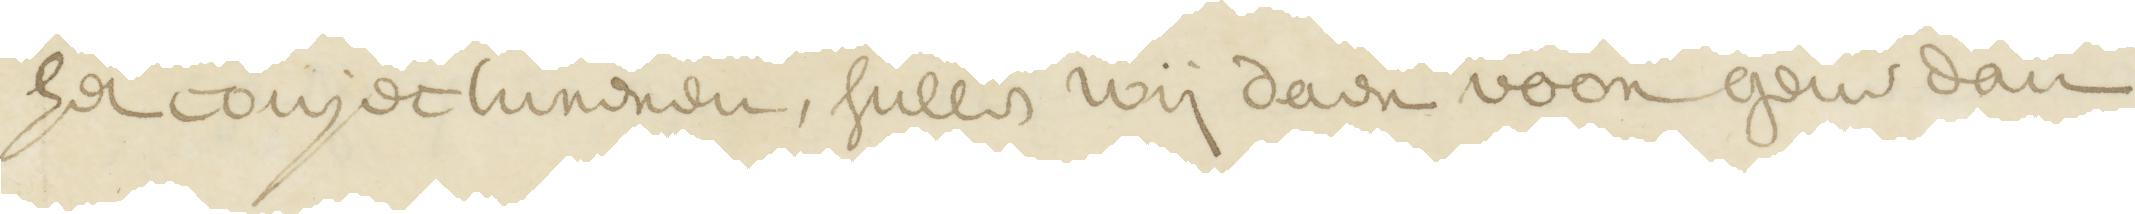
het conjectureren, sullen wij daer voor gene dan
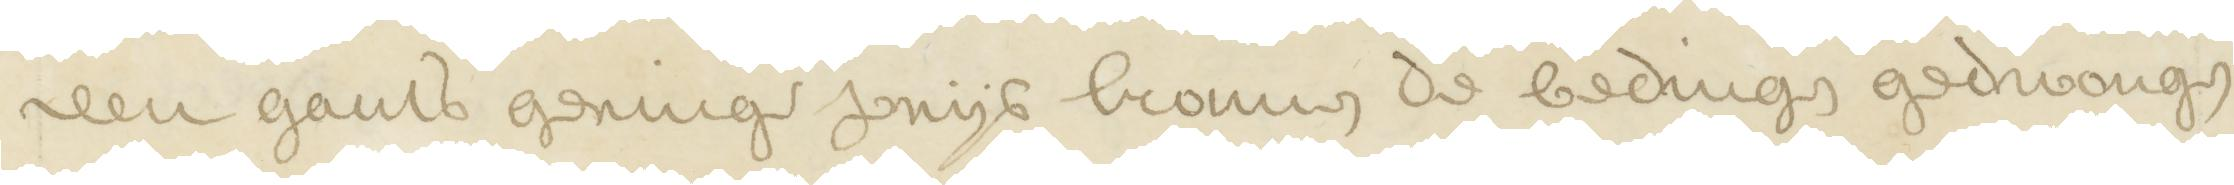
een gants geringe prijs konnen de bedingen gedwongen
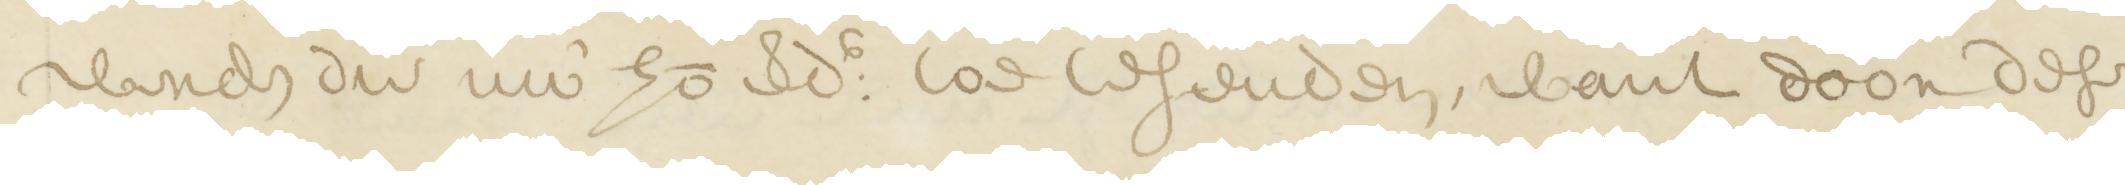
werden die uw ho Ed:s toe tesenden, want door dese
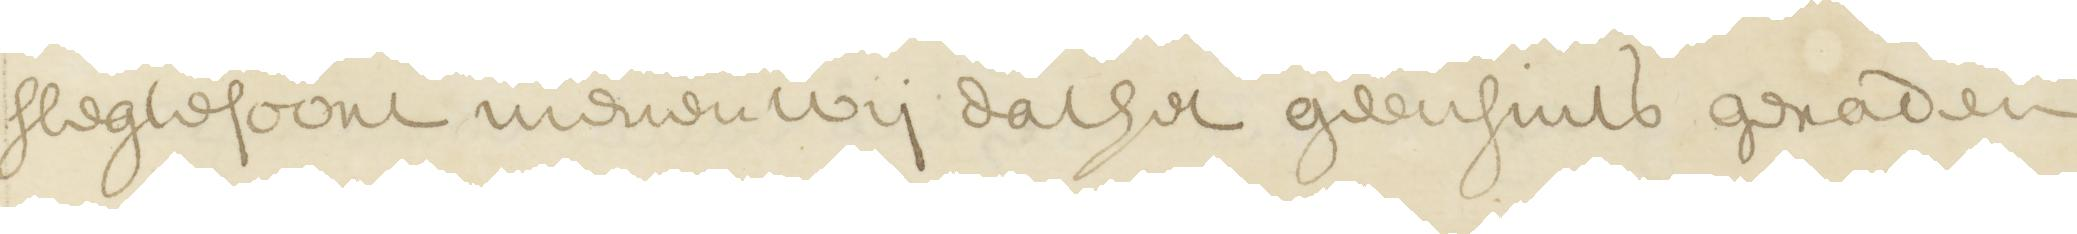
slegtesoort menen wij dathet geensints geraden
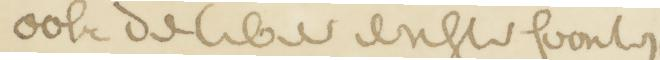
ook de twe erste soorten
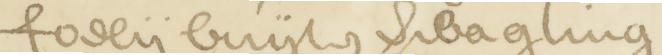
foelij buijten verwagting
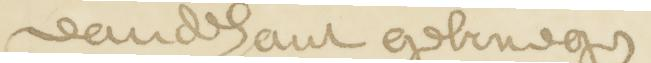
vandehant gekregen
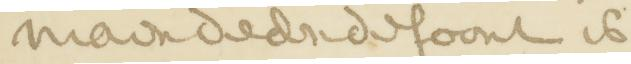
maer dederdesoort is
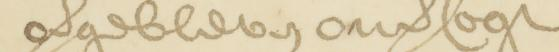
overgebleven onvercogt
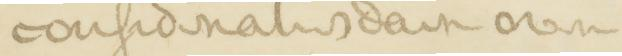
consideratien daer over
